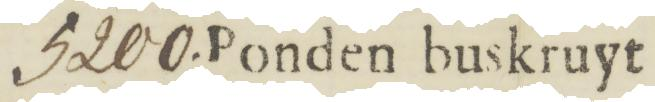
5200. Ponden buskruyt
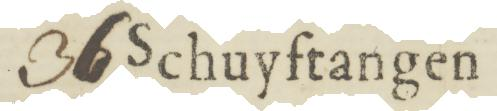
36. Schuyftangen
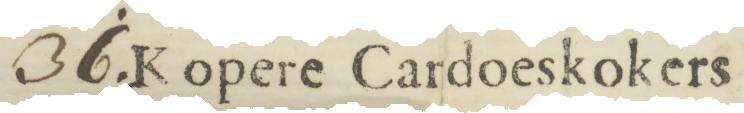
36. Kopere Cardoeskokers
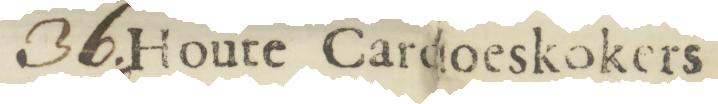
36. Houte Cardoeskokers
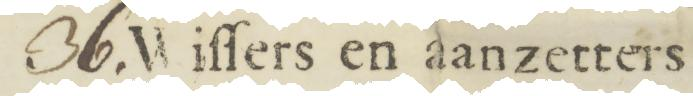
36. Wissers en aanzetters
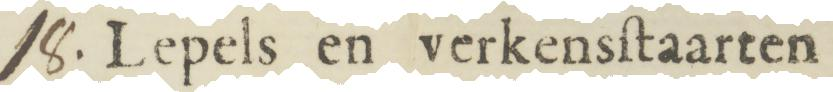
18. Lepels en verkensstaarten
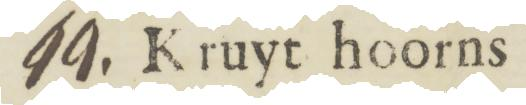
44. Kruyt hoorns
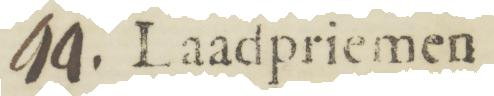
44. Laadpriemen
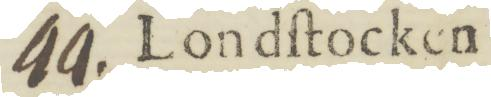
44. Londstocken
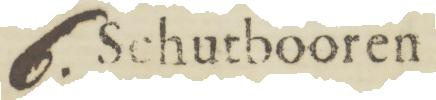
6. Schutbooren
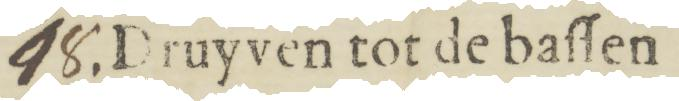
48. Druyven tot de bassen
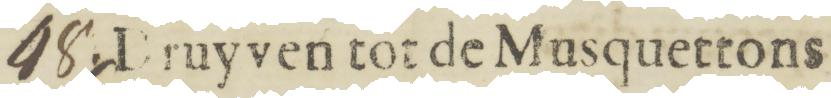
48. Druyven tot de Musquettons
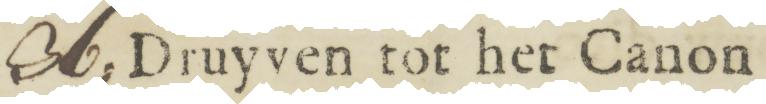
36. Druyven tot het Canon
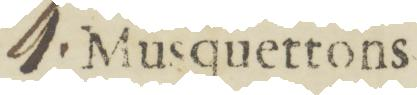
4. Musquettons
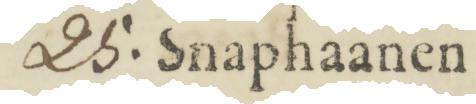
25. Snaphaanen
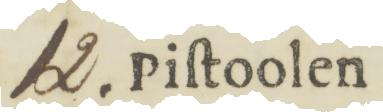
62. Pistoolen
